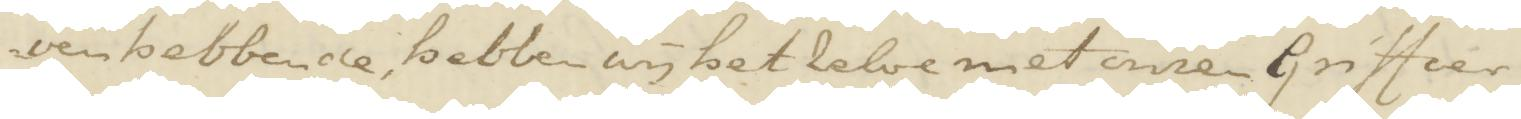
=ven hebbende, hebben wij het zelve met onzen Griffier
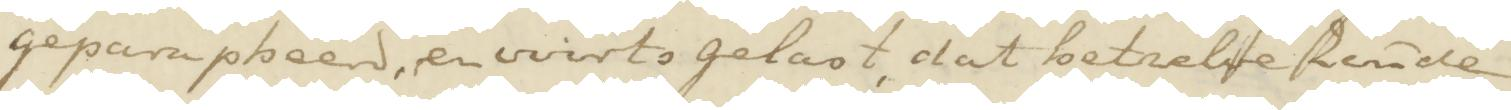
geparapheerd, en voorts gelast, dat hetzelve zoude
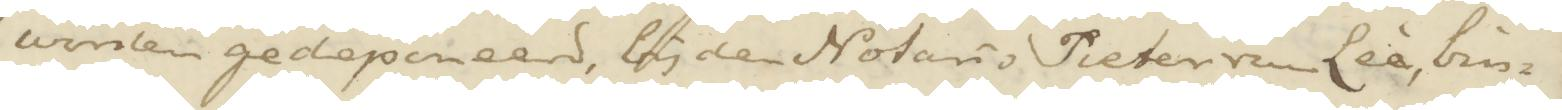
worden gedeponeerd, bij de Notaris Pieter van Lee, bin=
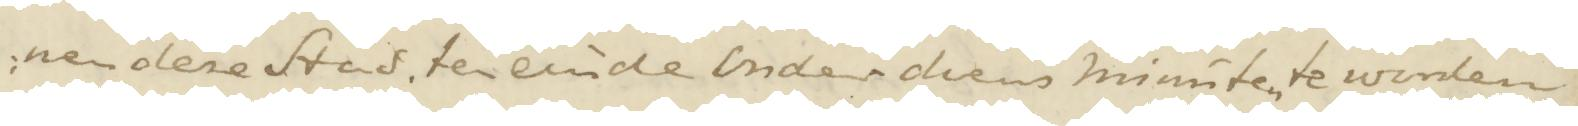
:nen deze stad, ten einde onder diens minuten te worden
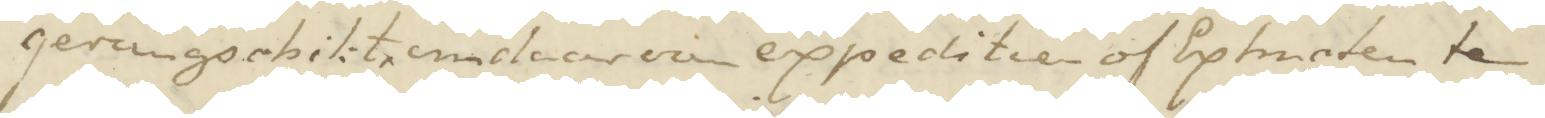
gerangschikt, om daar van expeditien of Extracten te
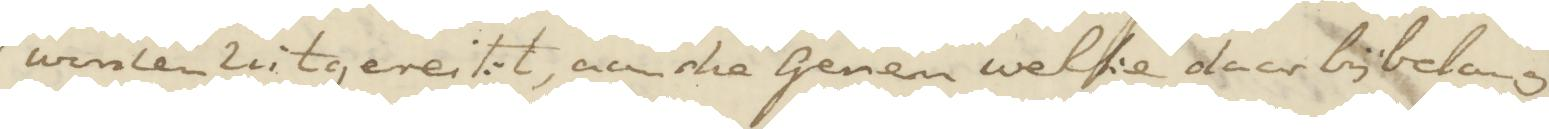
worden uitgereikt, aan die genen welke daar bij belang
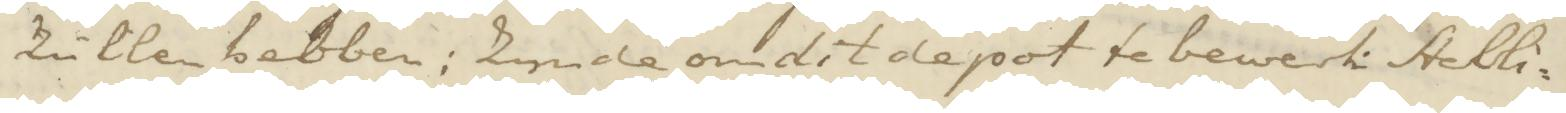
zullen hebben; zynde om dit depot te bewerk stelli:
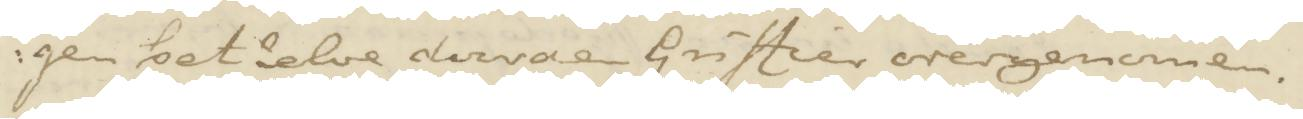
:gen het zelve door den Griffier overgenomen.
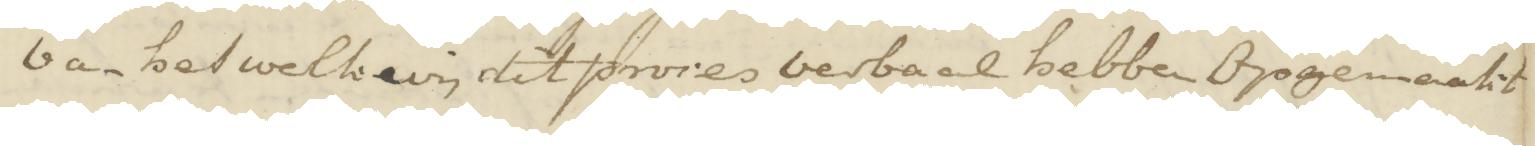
van het welk in dit proces verbaal hebben Opgemaakt
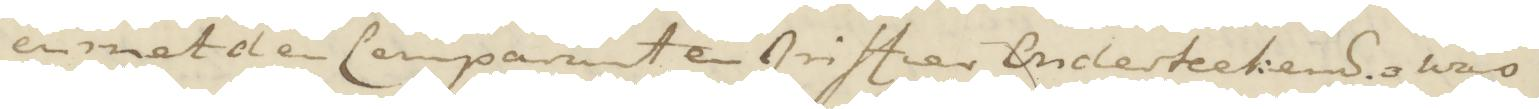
en met den Comparant en griffier Onderteekend. = was
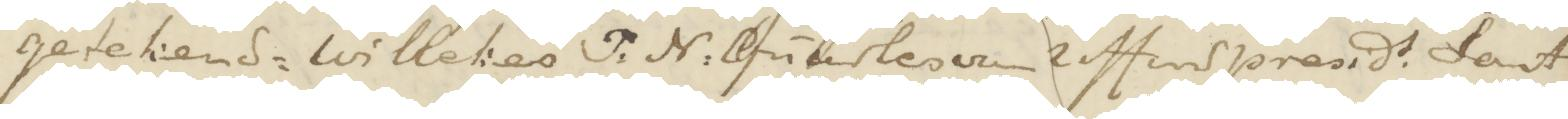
getekend = Willekes T. N. Quarles van Ufford presid.t Sant
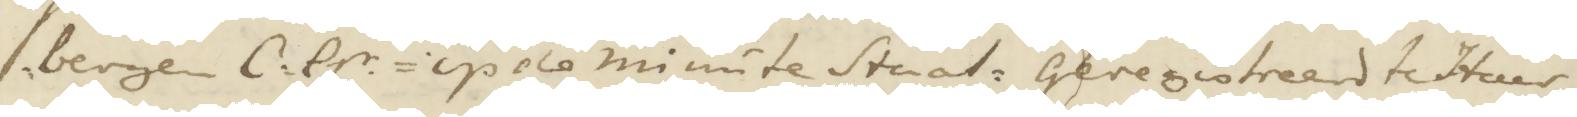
=bergen C: Gr:= op de minute staat: Geregistreerd te Haar:
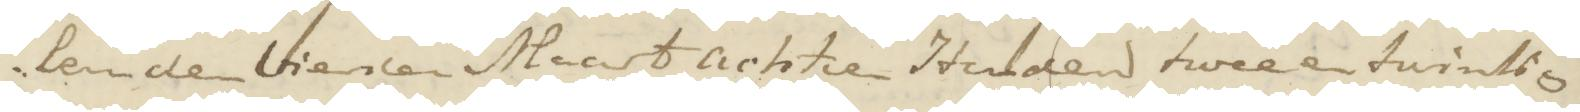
:lem den Vierden Maart achtien Honderd twee en twintig
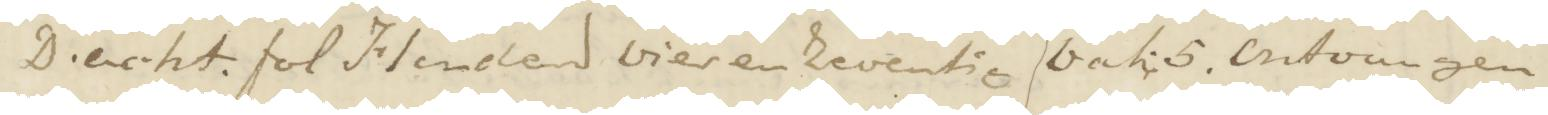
D'acht. fol Honderd vier en zeventig vak, 5, ontvangen
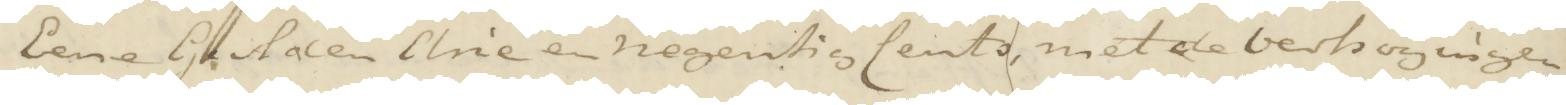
Eene Gulden drie en negentig Cents, met de verhogingen
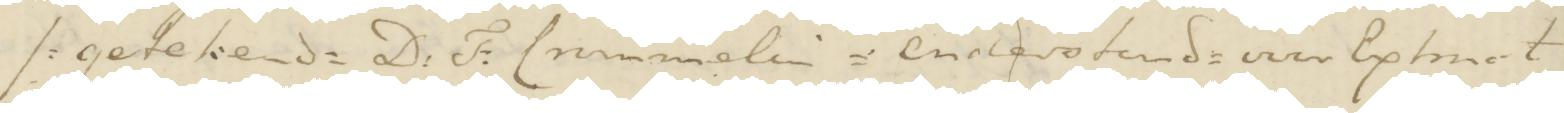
/= getekend= D: F: Crommelin = onderstond= voor Extract
